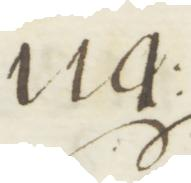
114:
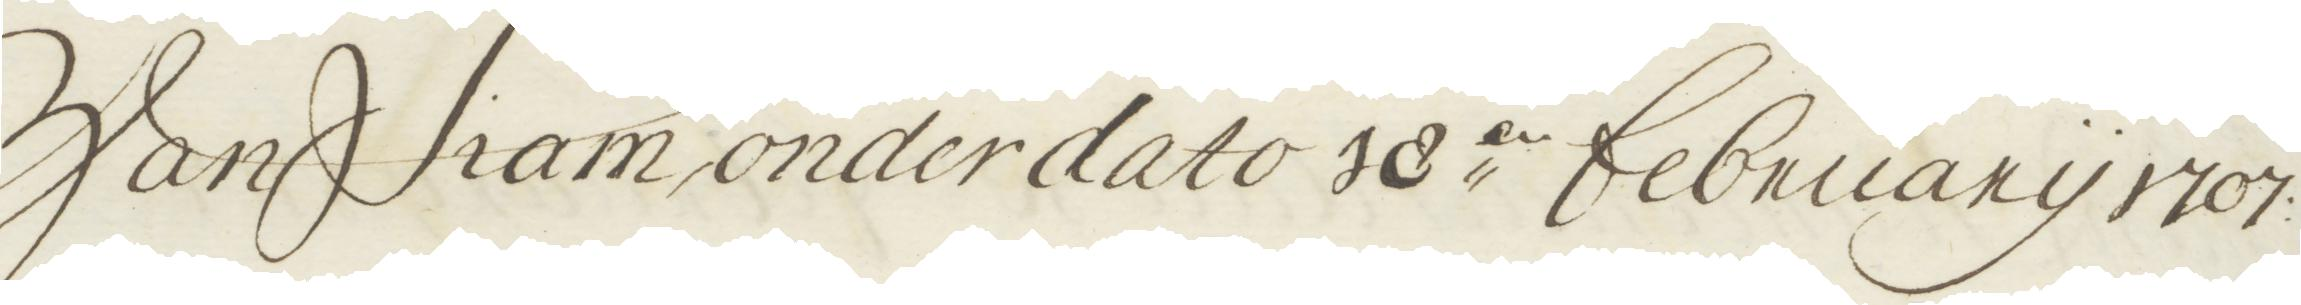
Van Siam, onder dato 18„en februarij 1707:
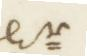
h=r
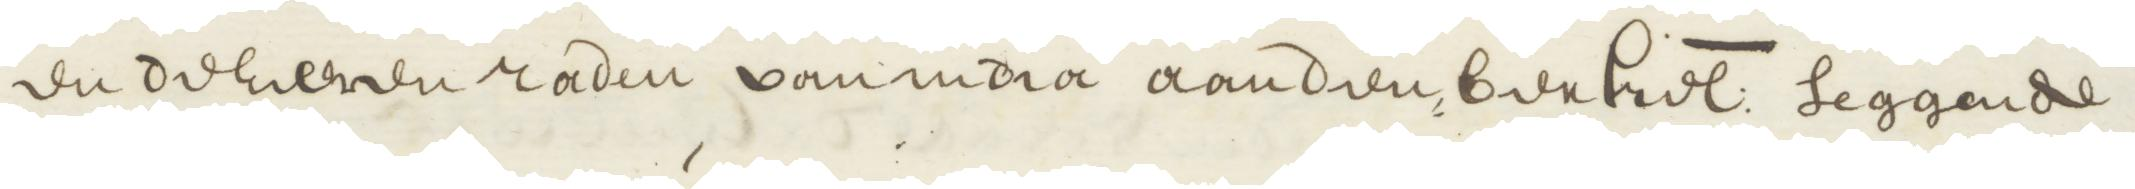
en de heeren raden van india aan den „ berkel: seggende
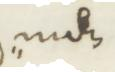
„men
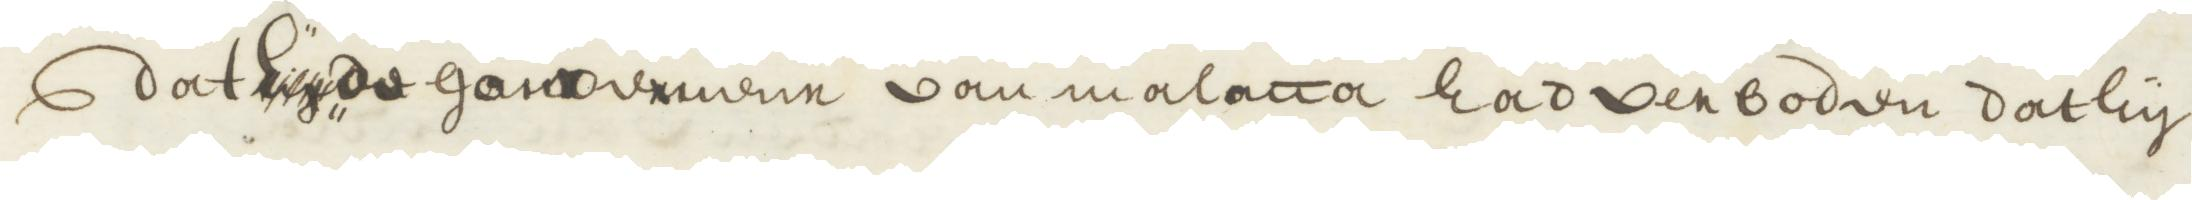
dat hij„de gouverneur van malacca had verboden dat hij
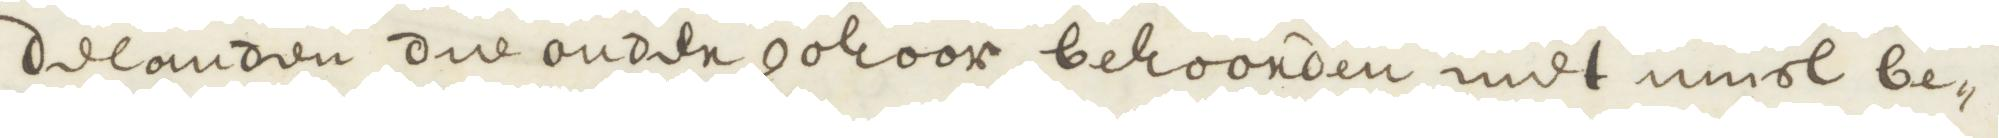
delanden die onder johoor behoorden niet must be„
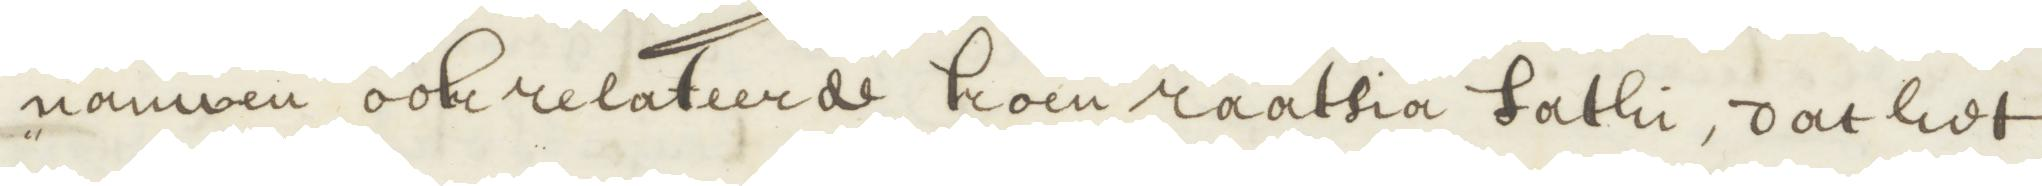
nauwen ook relateerde koen raatsia sathi, dat het
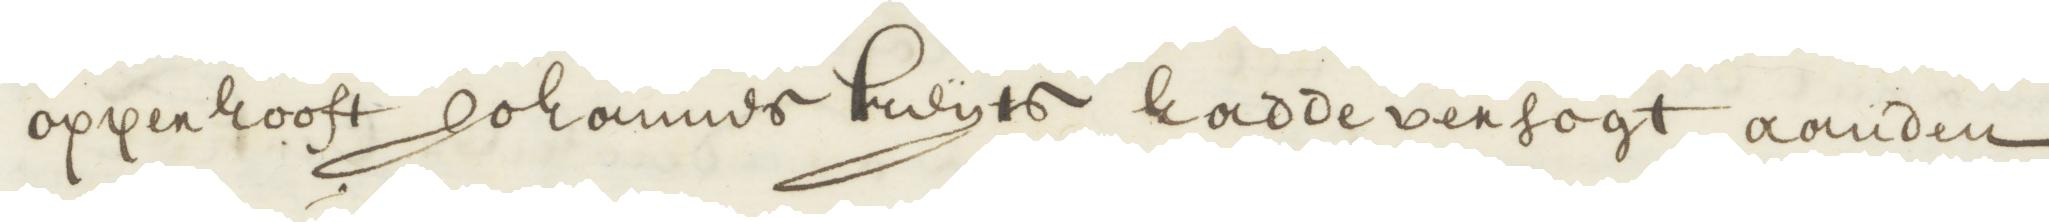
opperhooft Johannes keijts hadde versogt aan den
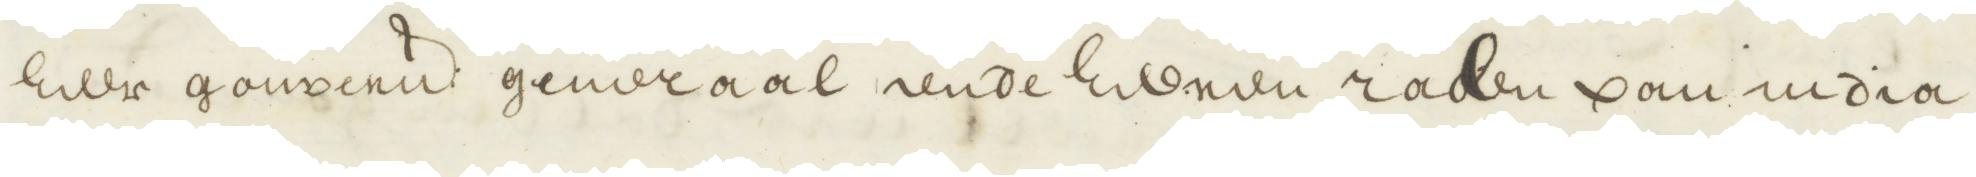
heer gouvern: generaal ende heeren raden van india
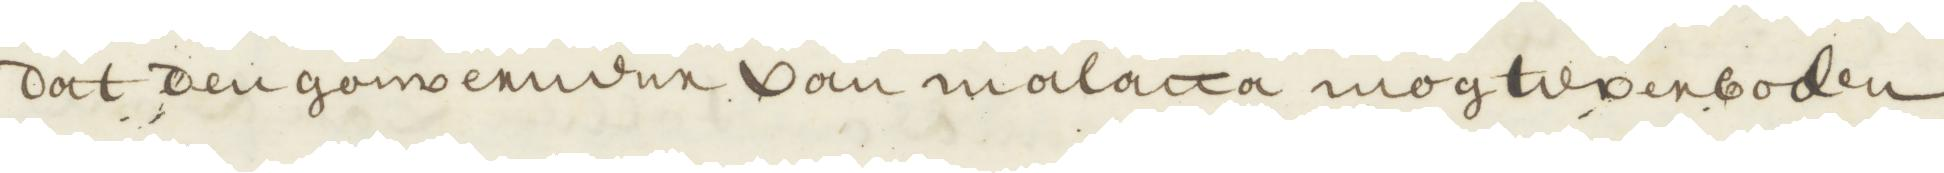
dat den gouverneur van malacca mogteverboden
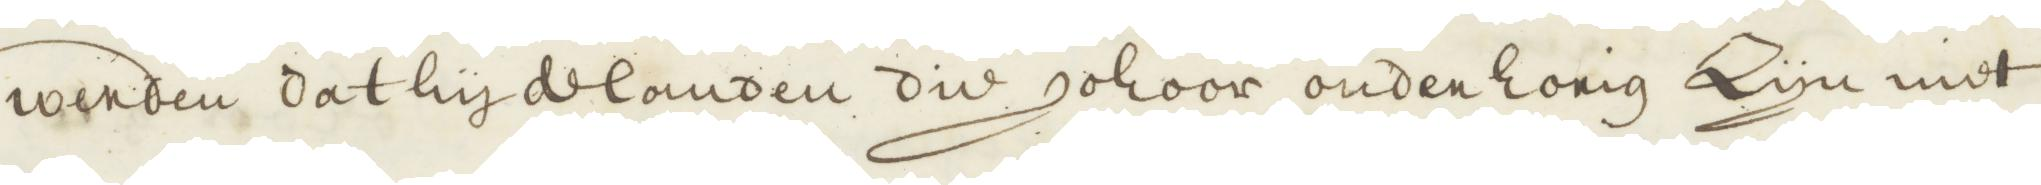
werden dat hij delanden die johoor onderhorig Zijn niet
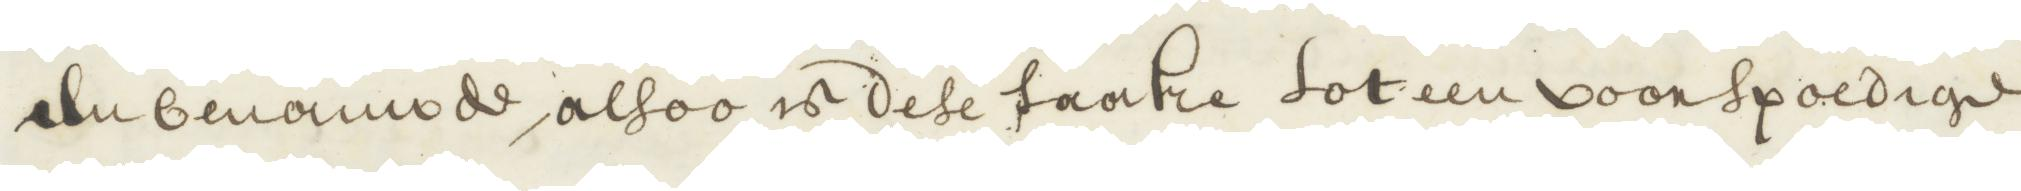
en benauwde, alsoo is dese saake tot een voorspoedige
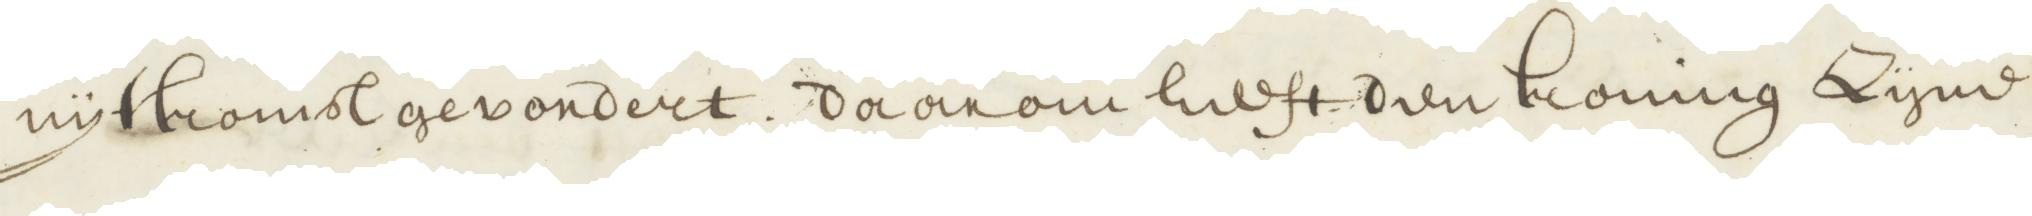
uijtkomst gevordert daarom heeft den koning Zijne
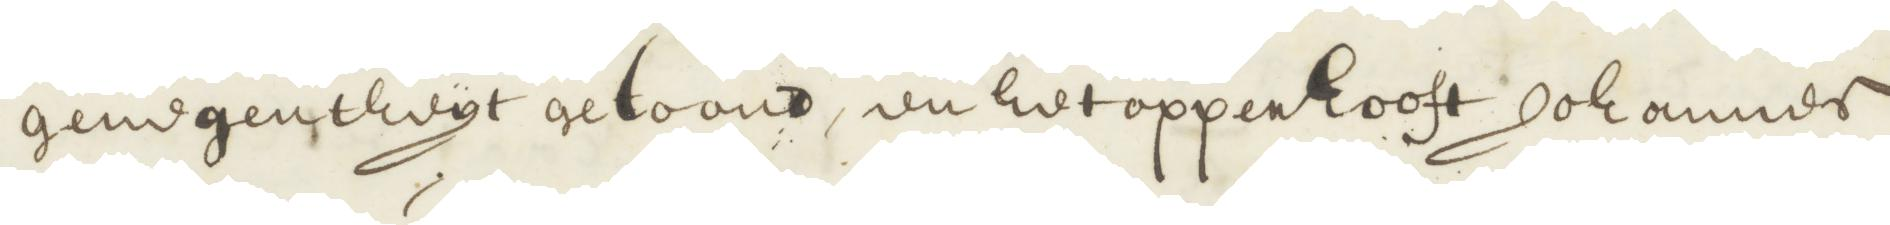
genegentheijt getoond, en het opperhooft Johannes
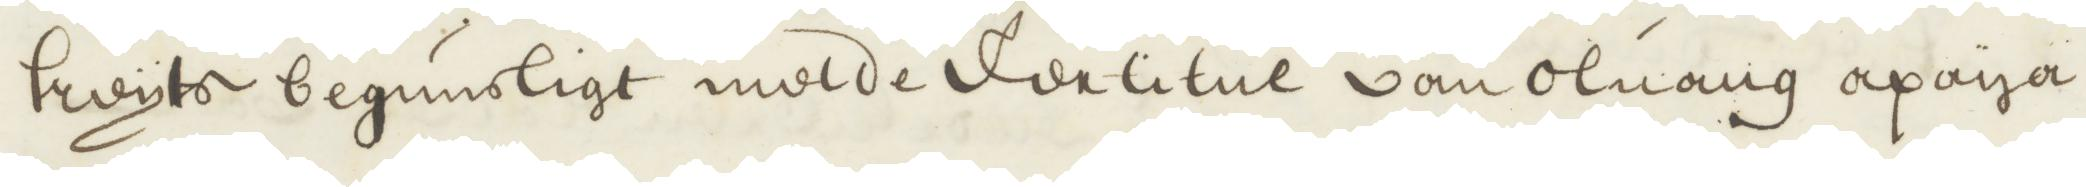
keijts begunstigt met de Eertitul van oluang apaija
